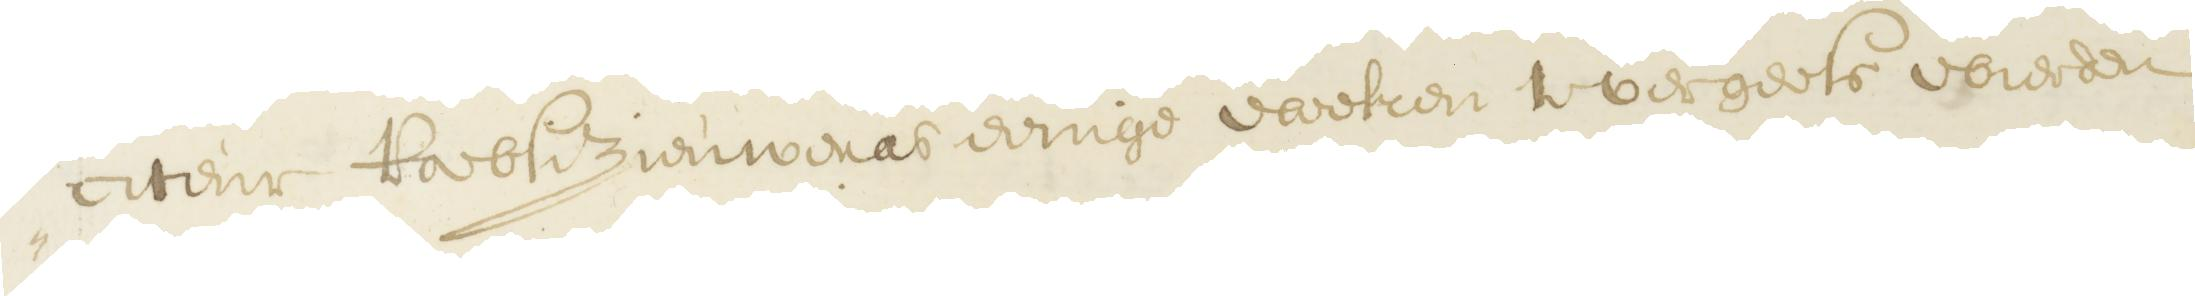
„citeur Vowsizieuweras eenige weeken te vergeefs wierden
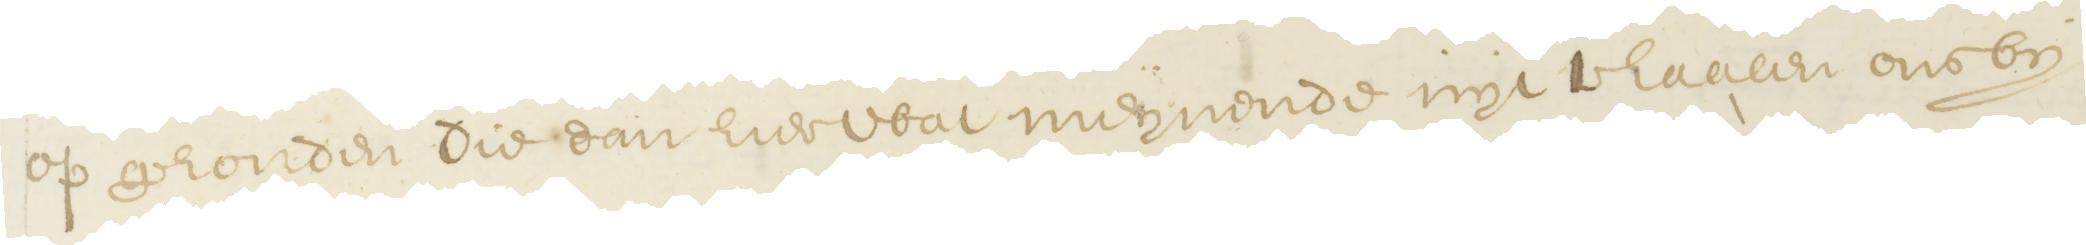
op gehouden die dan hierwat meijnende uijt te haalen ons bij
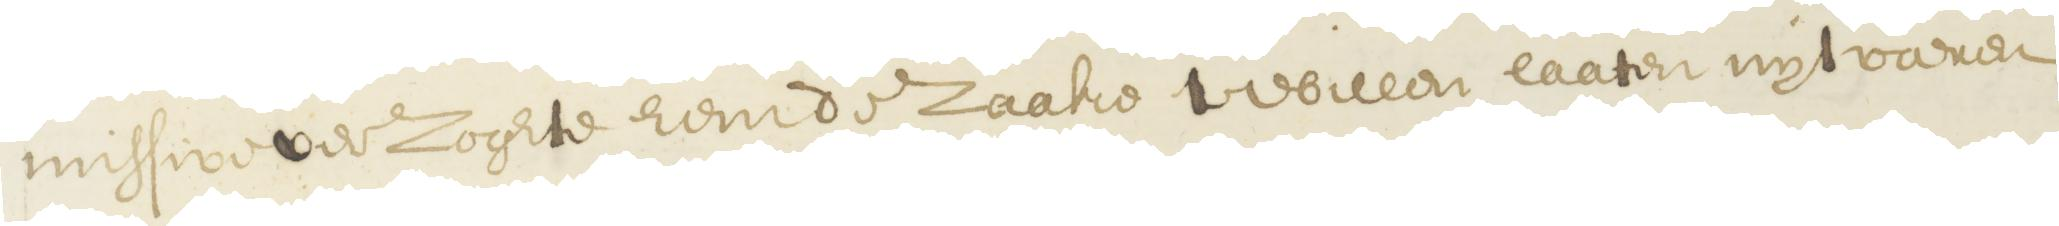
missive verzoghte hem de zaake tewillen laaten uijtvoeren
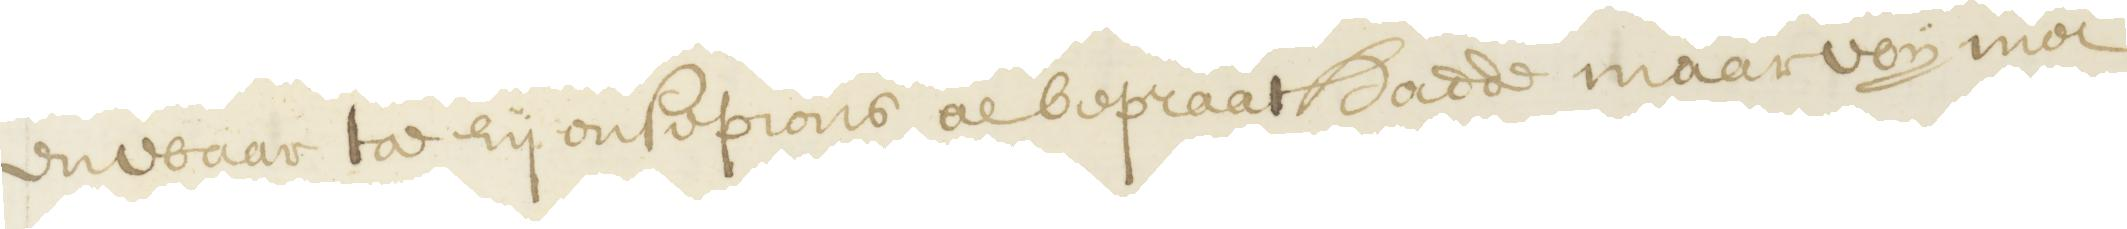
enwaar toe hij onsepions al bepraat hadde maar wij met
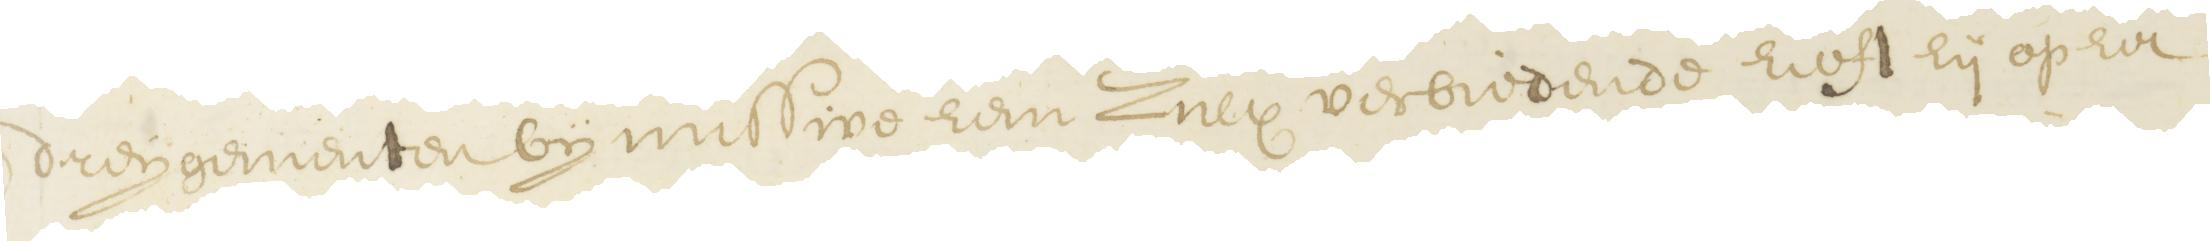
dreijgementen bij missive hem zulx verbiedende heeft hij op het
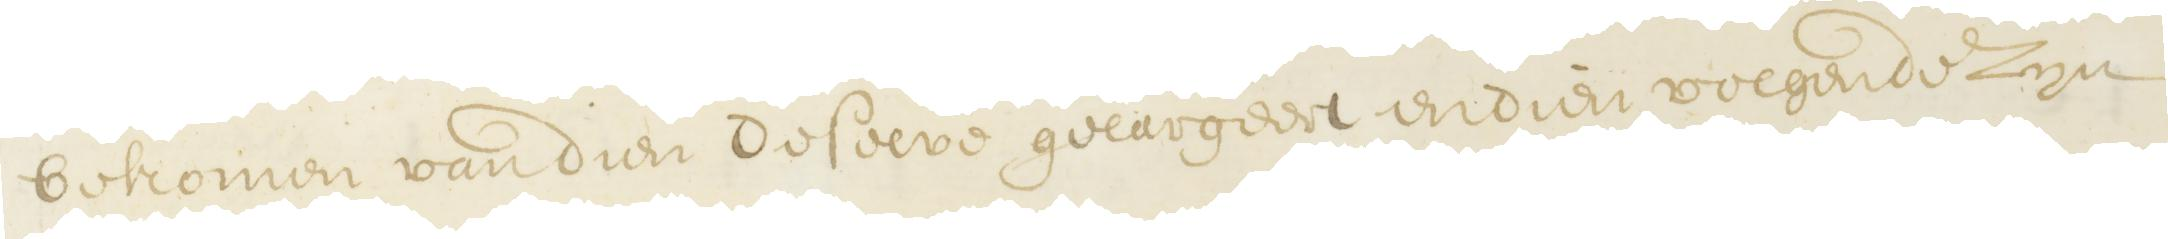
bekomen van dien deselve gelargeert en dien volgende zijn
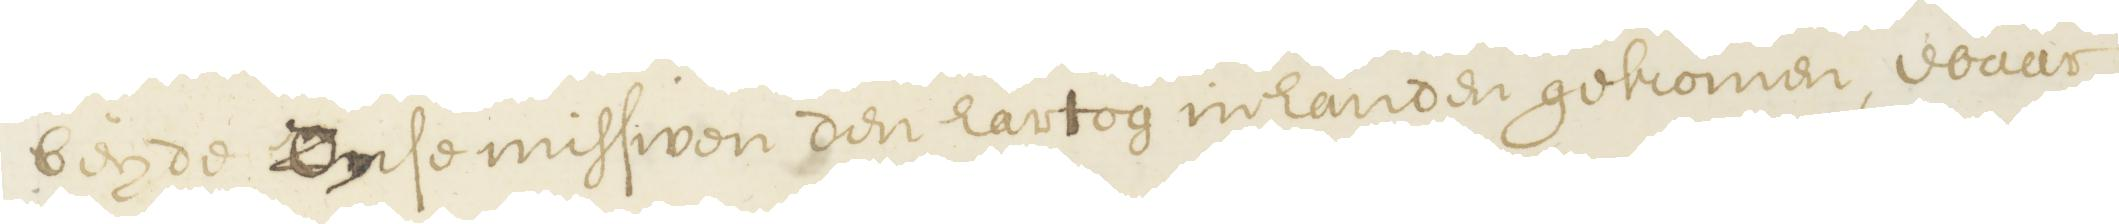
beijde Onse missiven den hartog in handen gekomen, waar
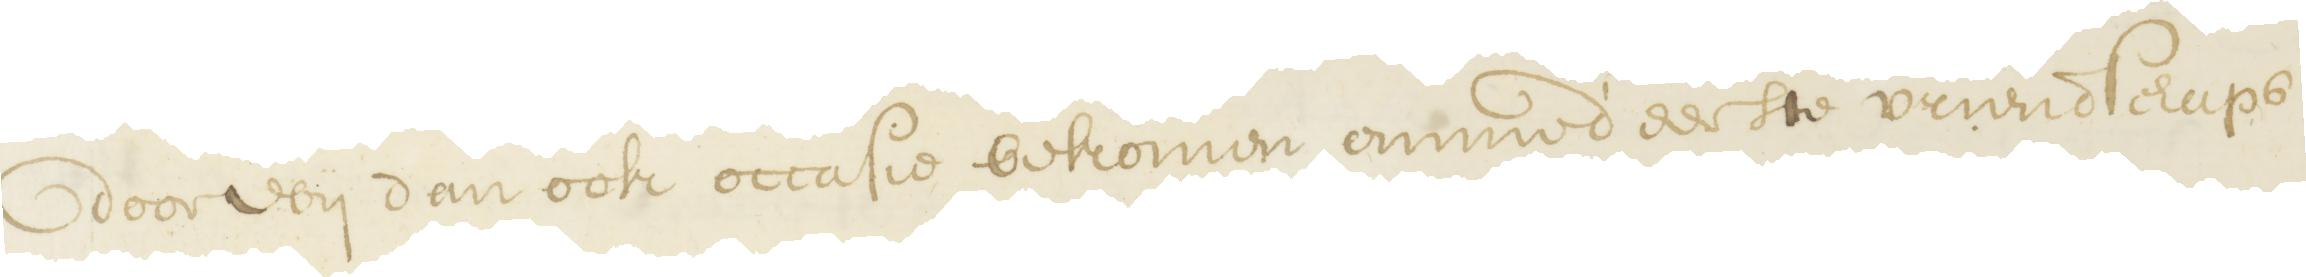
door wij dan ook occasie bekomen omme d' eerste vriendschaps
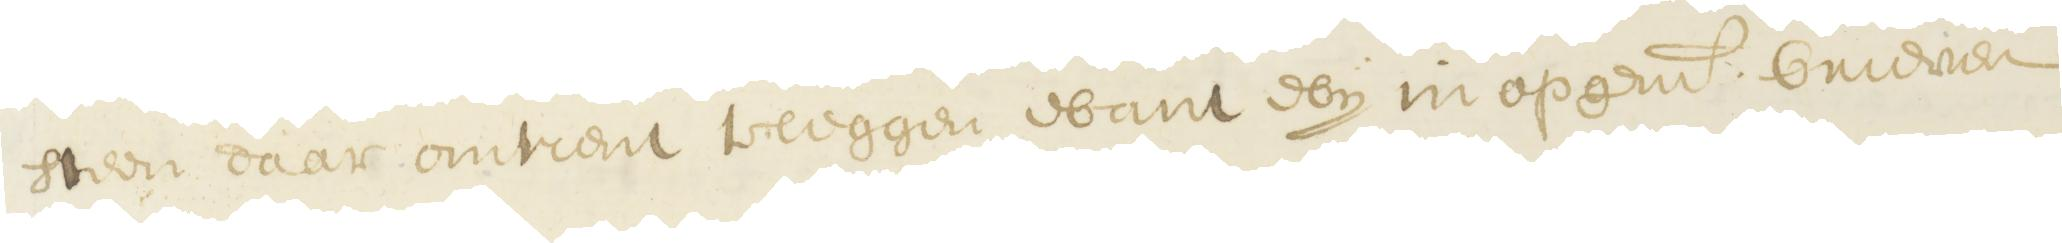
steen daar omtrent teleggen want wij in op gem: brieven
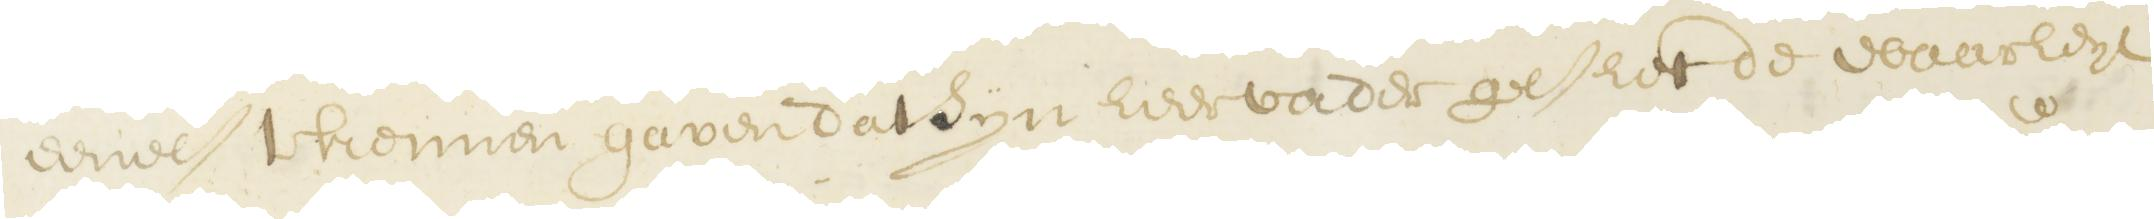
eenelijk te kennen gaven dat sijn heervader gelijk het de waarheijt
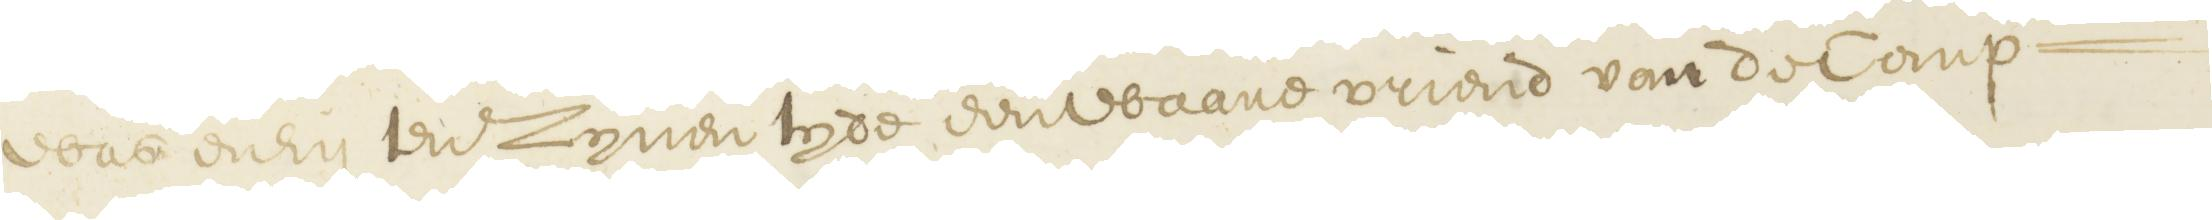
was enhij ten zijnen tijde eenwaare vriend van de Comp=e
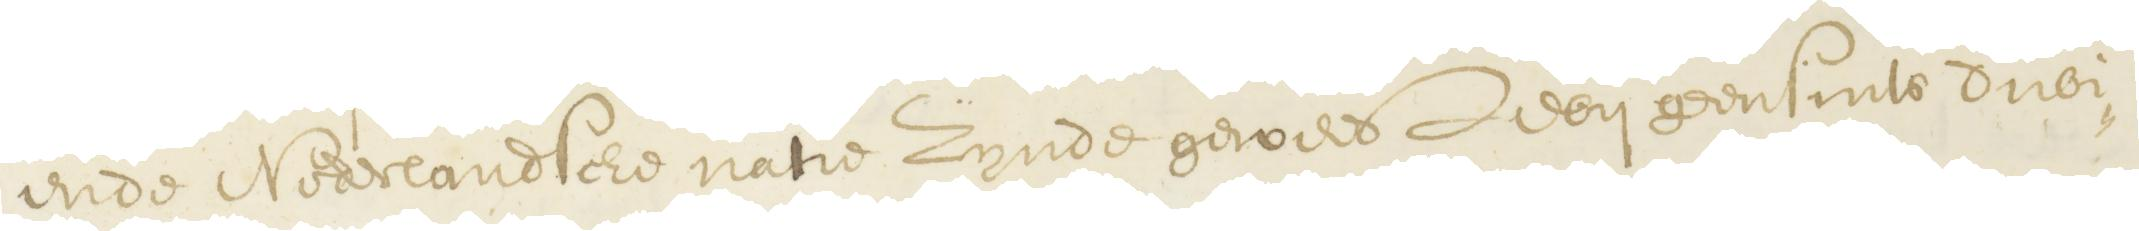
ende Nederlandsche natie zijnde geweest wij geensints dubi„
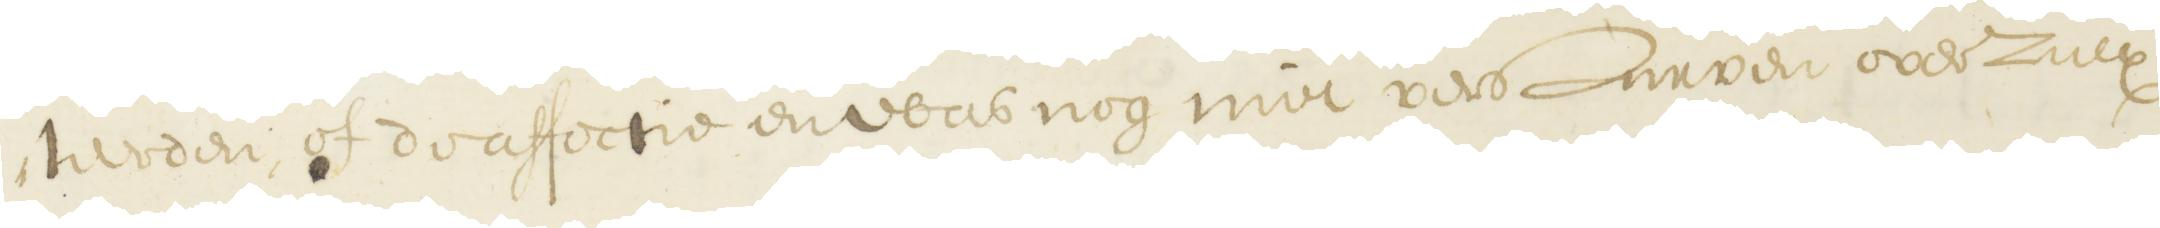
„teerden, of de effectie en was nog niet versturven over zulx
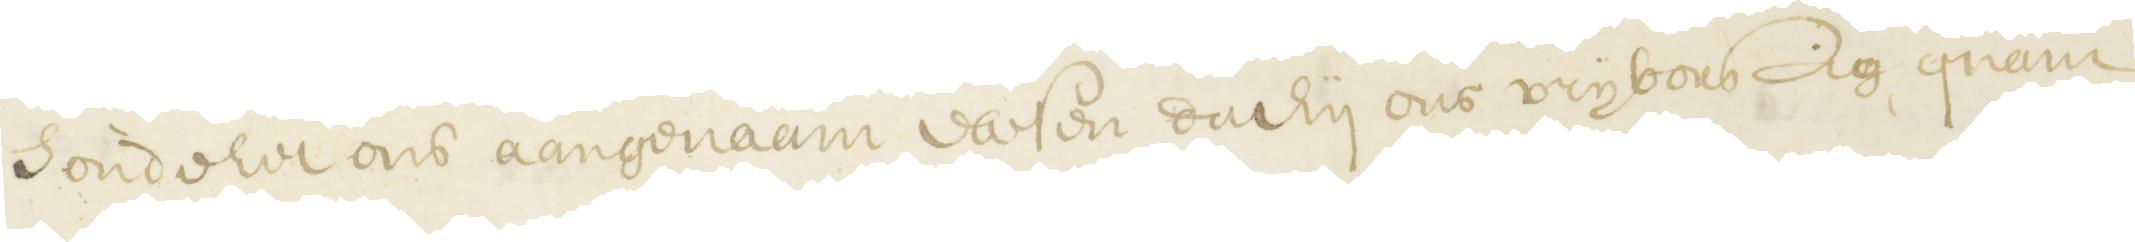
soude het ons aangenaam wesen dathij ons vrijborstig, quam
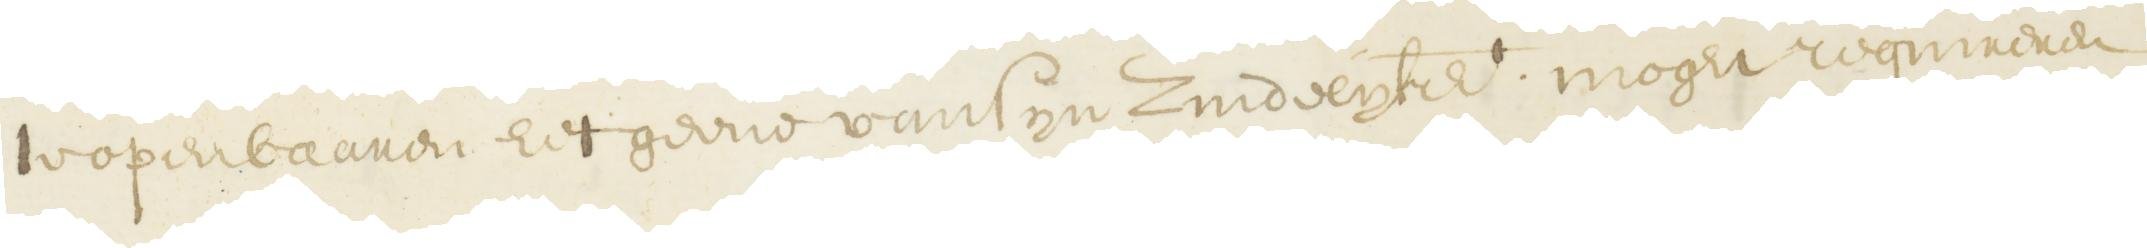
te openbaaren het geene van sijn zindelijkh.t moght requireren
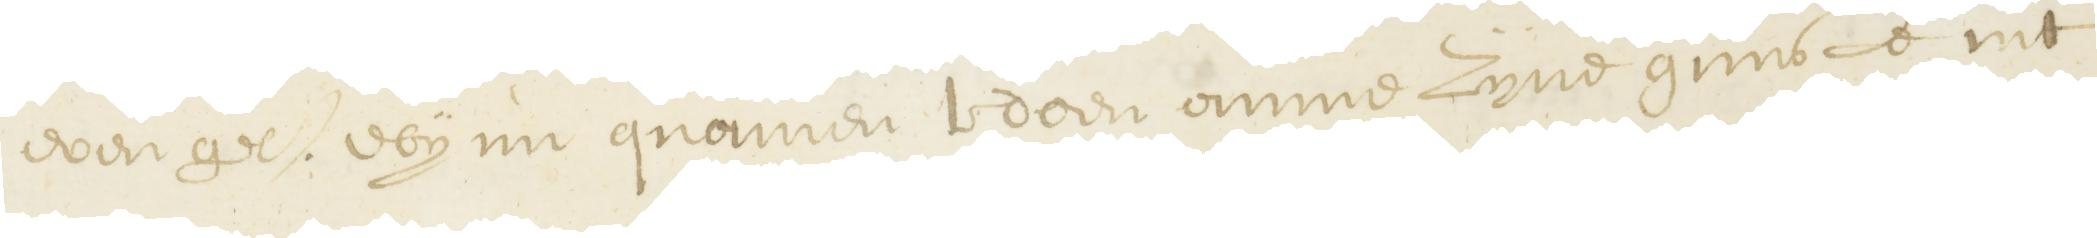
even gelijk wij nu quamen te doen omme zijne gunste in't
